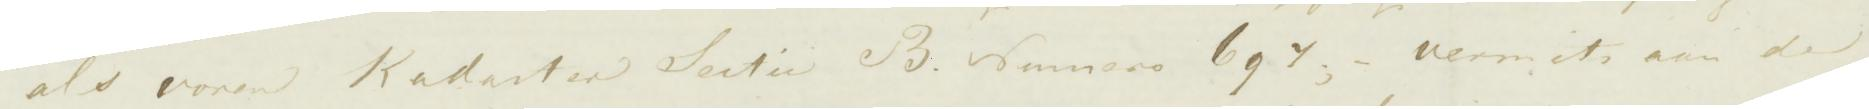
als voren Kadaster Sectie B. Numero 697; - vermits aan de
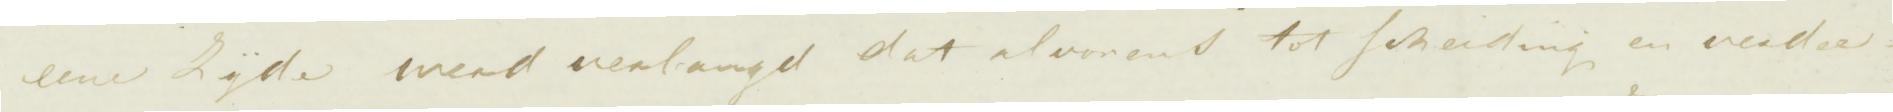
eene zijde werd verlangd dat alvorens tot scheiding en verdee
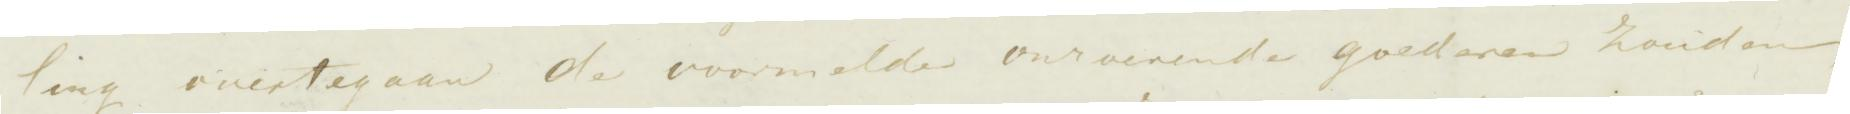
ling overtegaan de voormelde onroerende goederen zouden
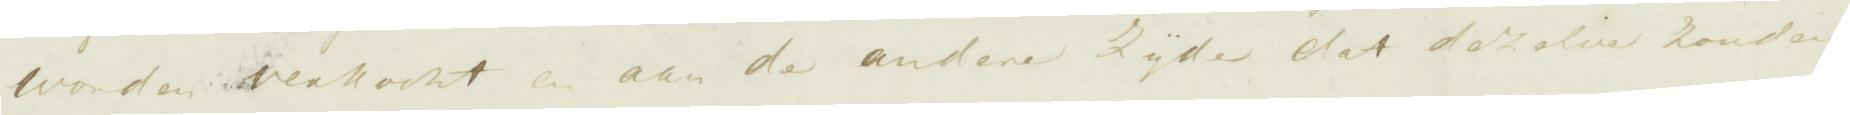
worden verkocht en aan de andere zijde dat dezelve zouden
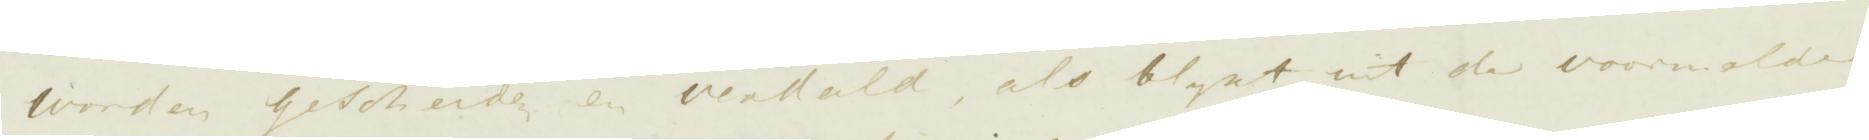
worden gescheiden en verdeeld, als blykt uit de voormelde
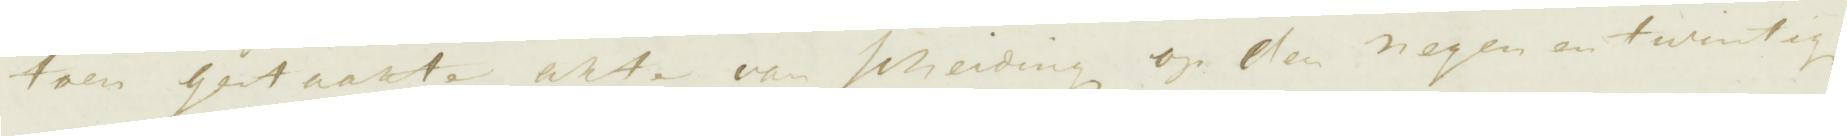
toen gestaakte akte van scheiding op den negen en twintig
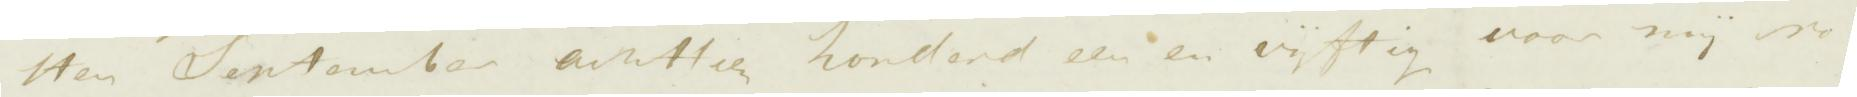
sten September achttien honderd een en vijftig voor mij No
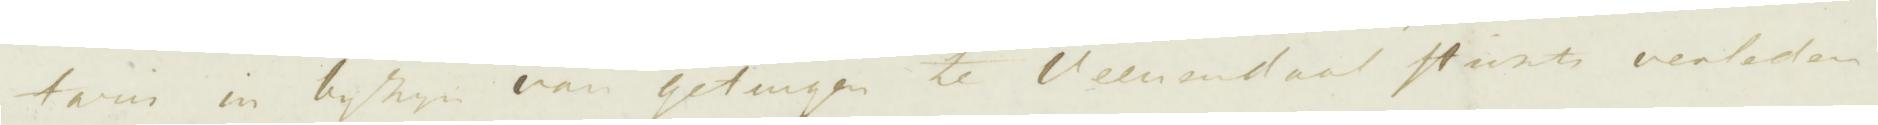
taris in byzyn van getuigen te Veenendaal stichts verleden
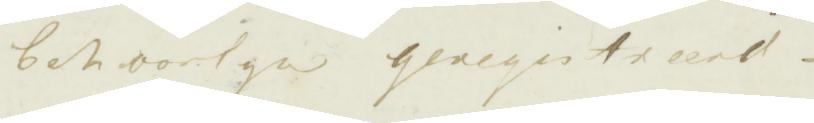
behoorlyk geregistreerd-
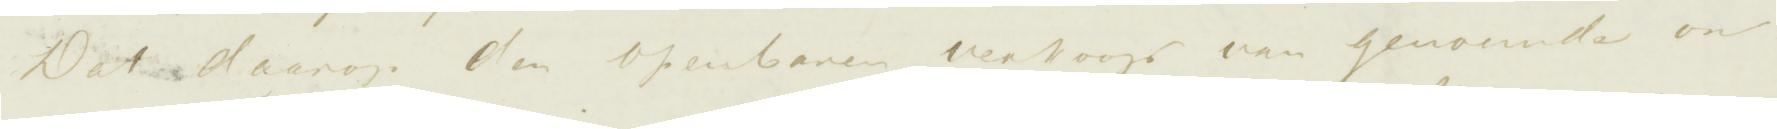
Dat daarop den openbaren verkoop van genoemde on
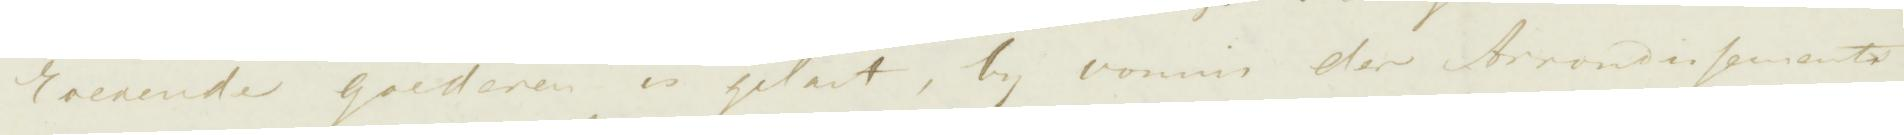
roerende goederen is gelast, bij vonnis der Arrondissements
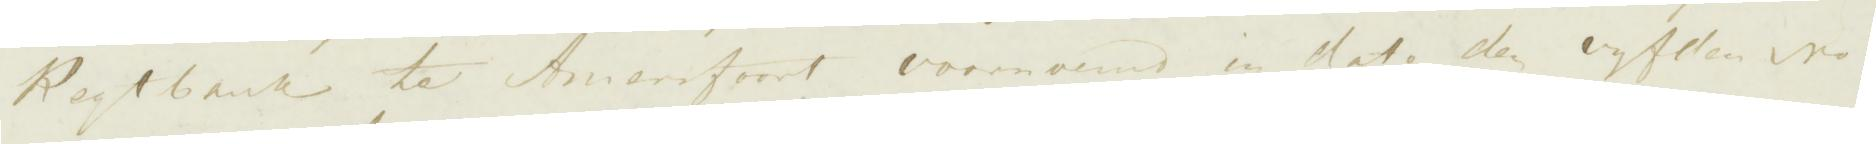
Regtbank te Amersfoort voornoemd in dato den vyfden No
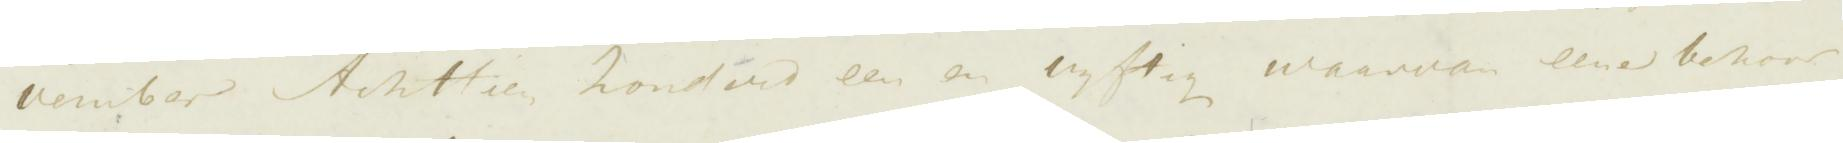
vember Achttien honderd een en vyftig waarvan eene behoor
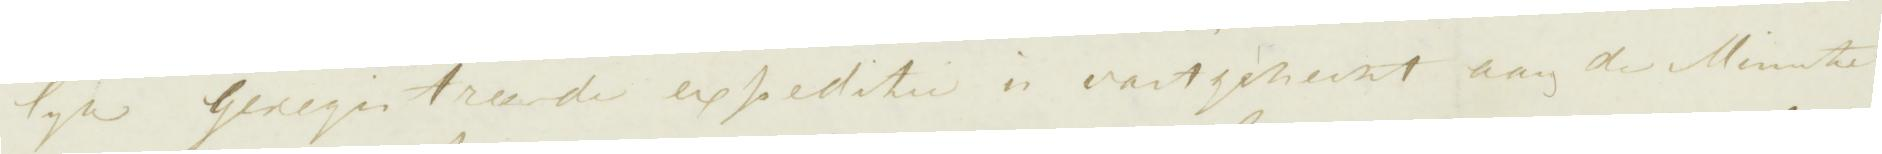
lyk Geregistreerde expeditie is vastgehecht aan de Minute
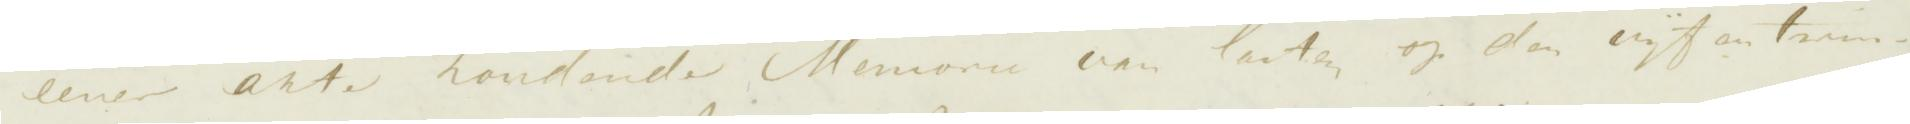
eener akte houdende Memorie van lasten op den vijf en twin
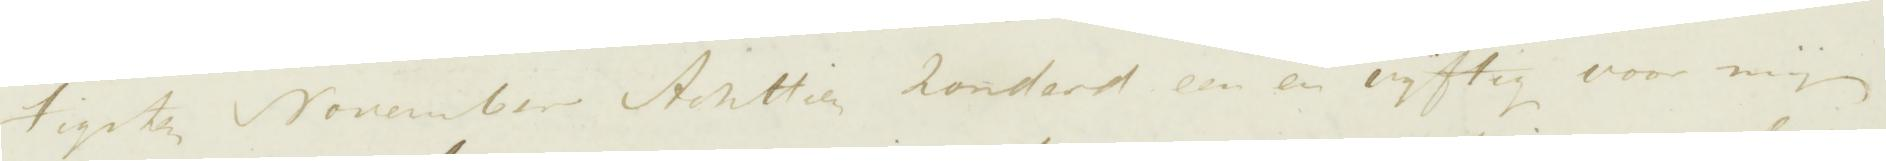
tigsten November Achttien honderd een en vijftig voor mij
